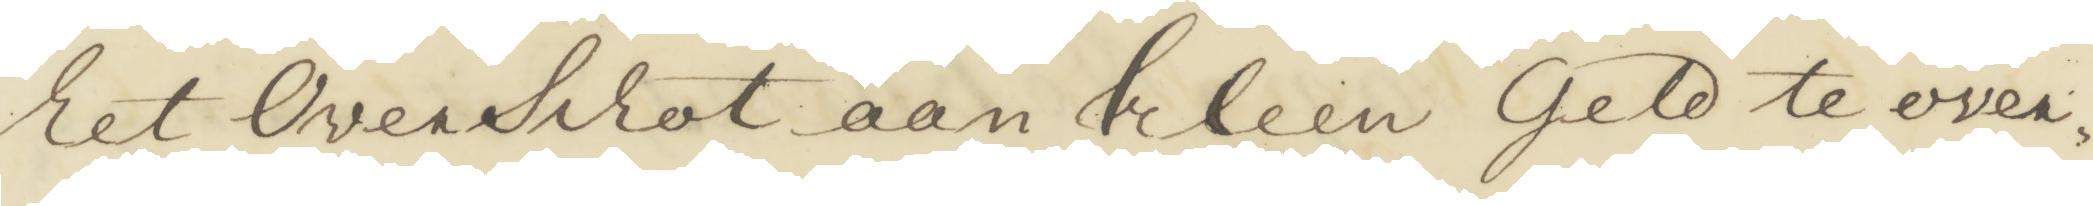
het Overschot aan kleen geld te over„
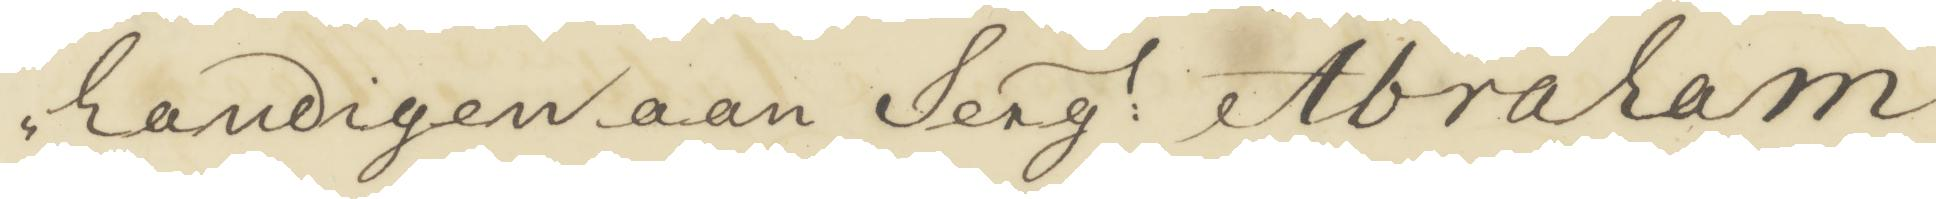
„handigen aan Serg:t Abraham
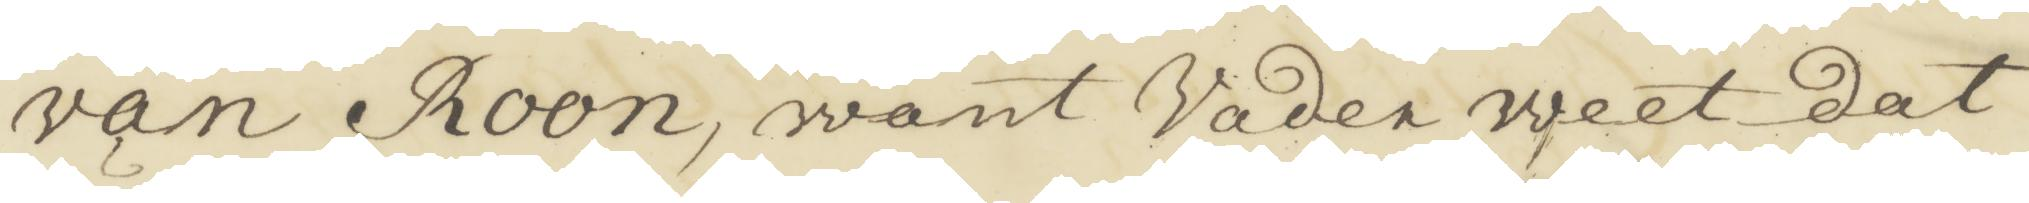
van Roon, want vader weet dat
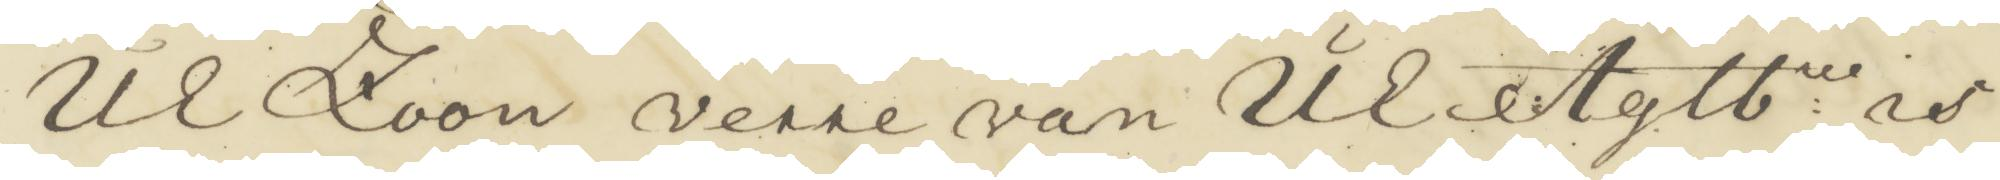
UE Zoon verre van UE Agtb:e is
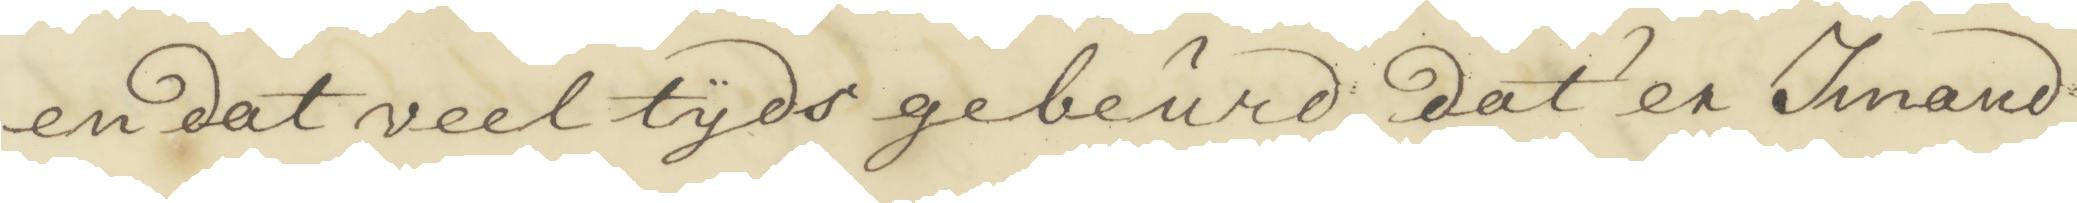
en dat veel tijds gebeurd, dat 'er Imand
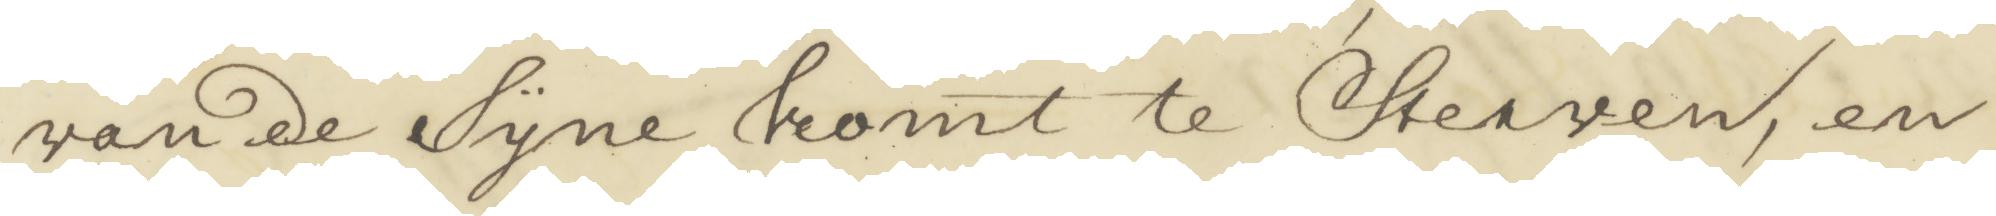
van de Sijne komt te Sterven, en
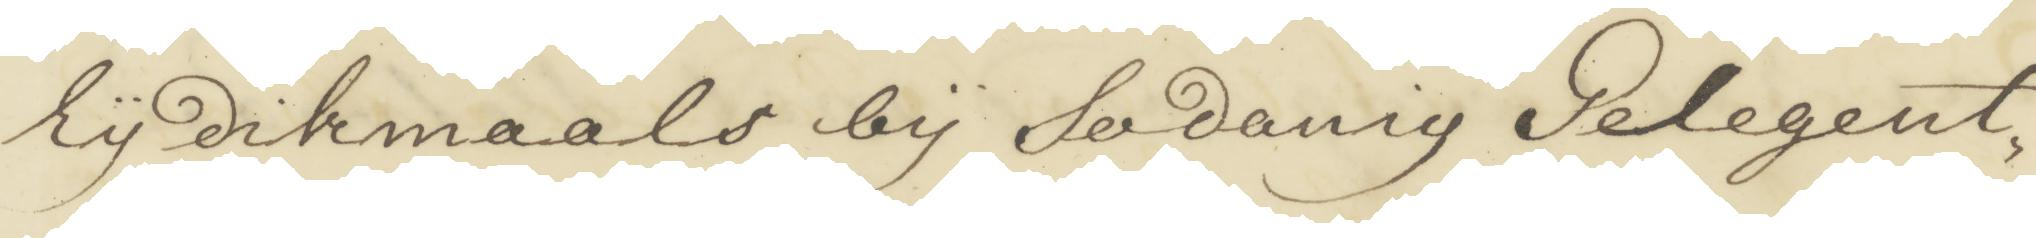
hij dikmaals bij Sodanig Gelegent„
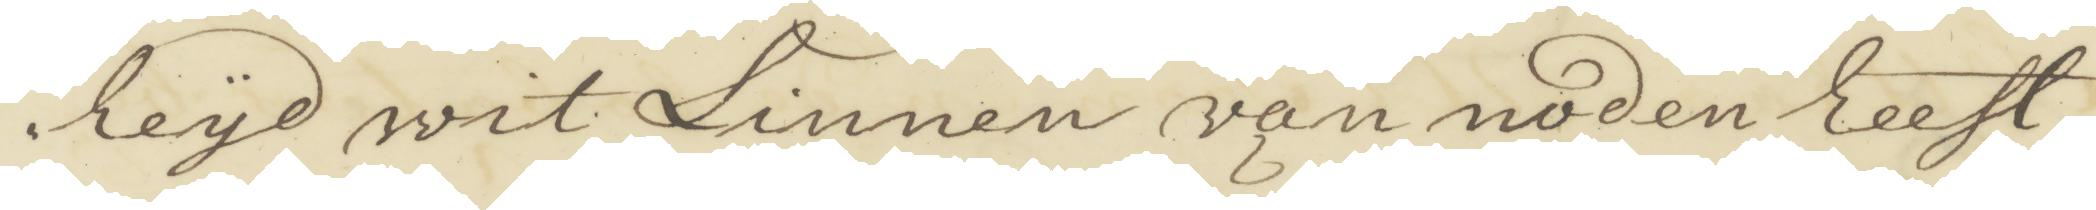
heijd wit Linnen van noden heeft,
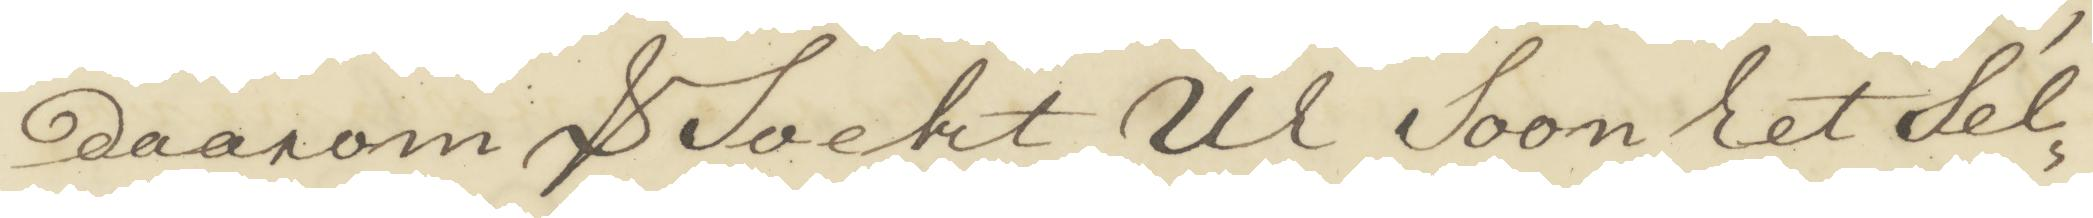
daarom Versoekt UE Soon het Sel„
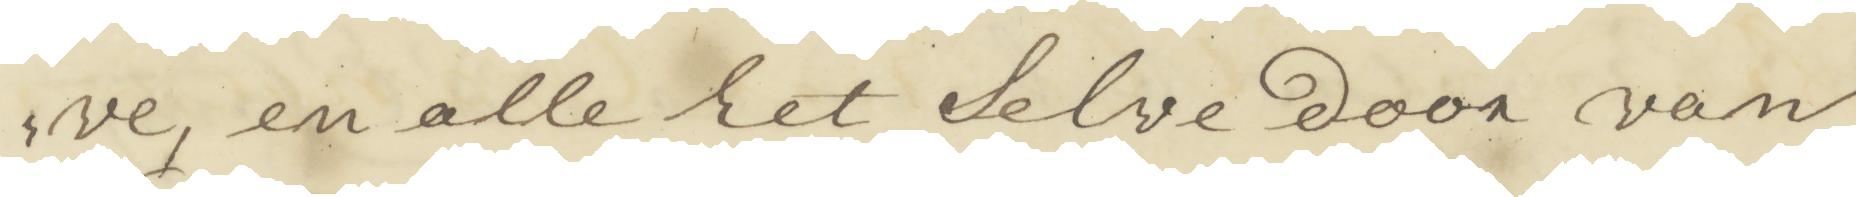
„ve, en alle het Selve door van
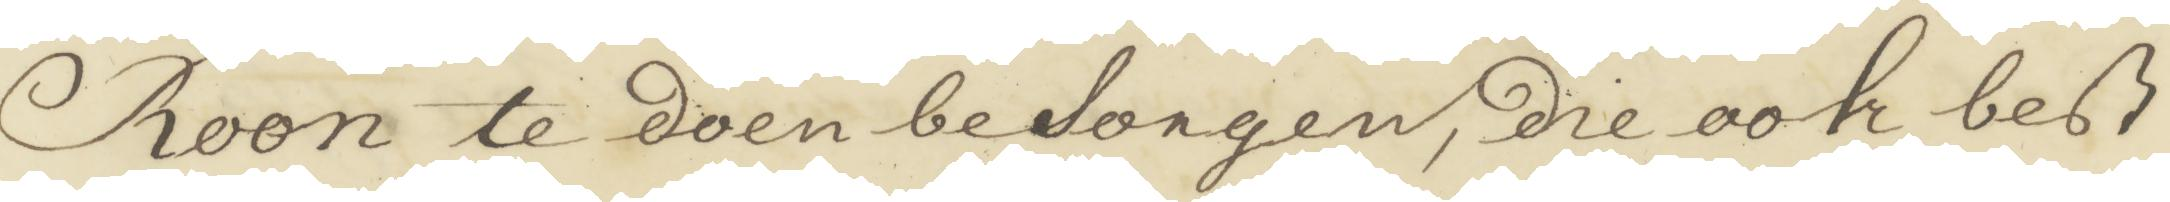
Roon te doen besorgen, die ook best
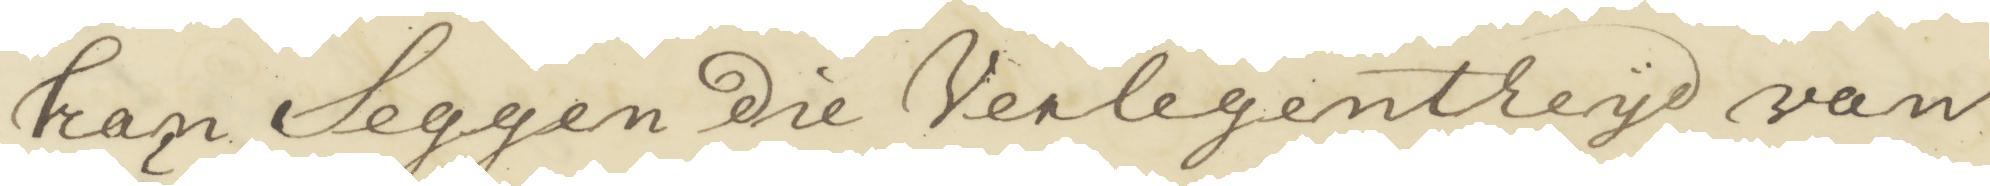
kan Seggen die Verlegentheijd van
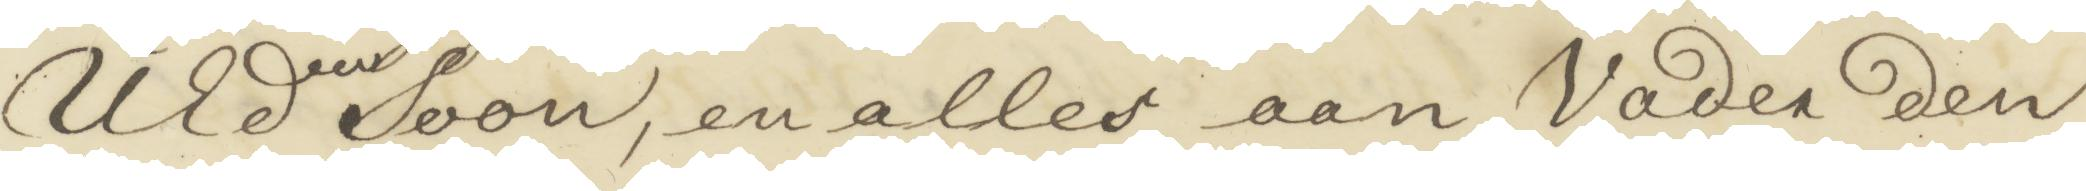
U Ede Soon, en alles aan Vader den
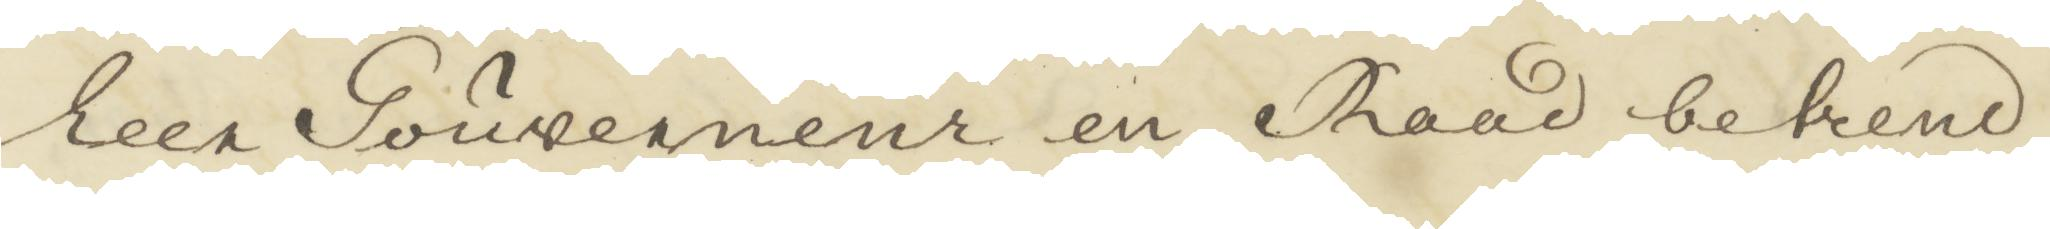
heer Gouverneur en Raad bekend
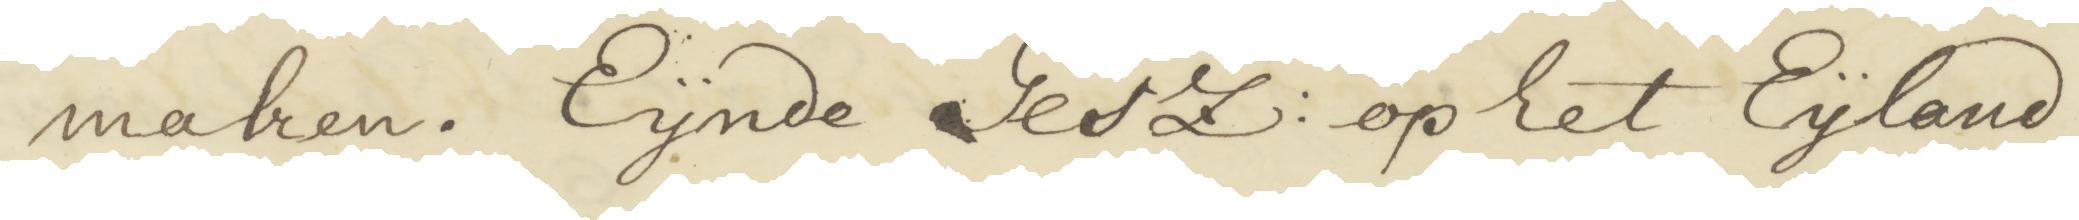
maken. Eijnde Gesz: op het Eijland
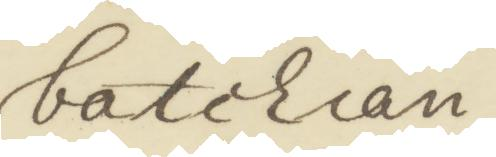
batchian
